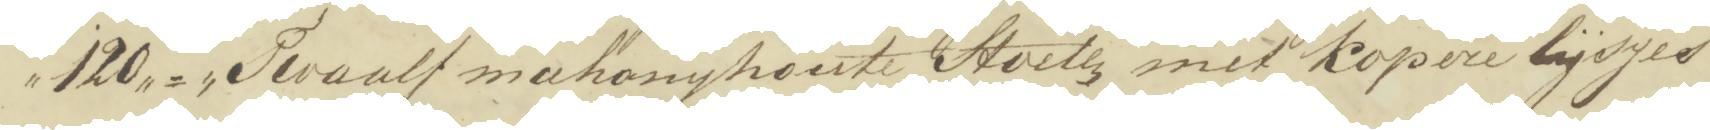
„ 120„ =„ Twaalf mahonyhoute stoelen met kopere lijsjes
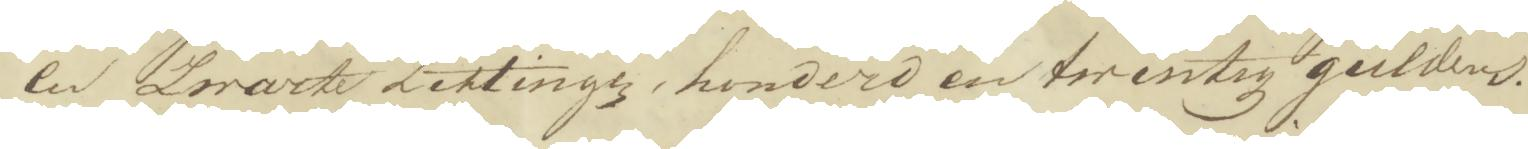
en zwarte zittingen, honderd en twintig guldens.
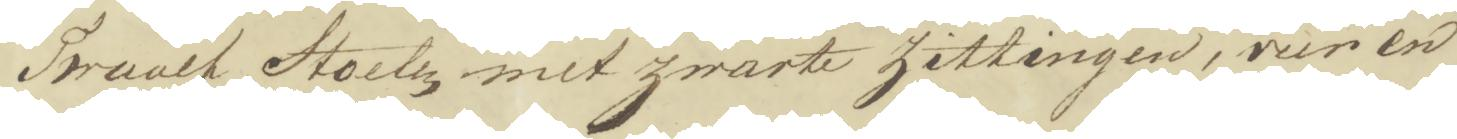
Twaalf stoelen met zwarte zittingen, vier en
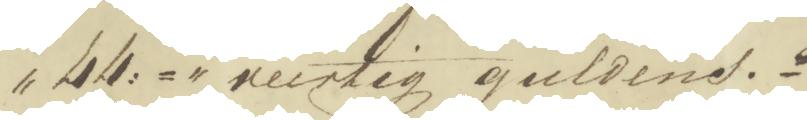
„ 44:=„ veertig guldens.-
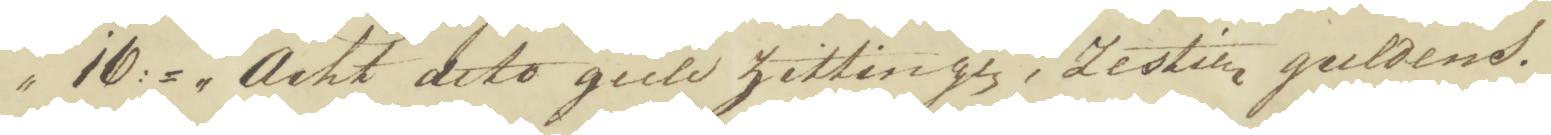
„ 16:=„ Acht dito geele zittingen, Zestien guldens.
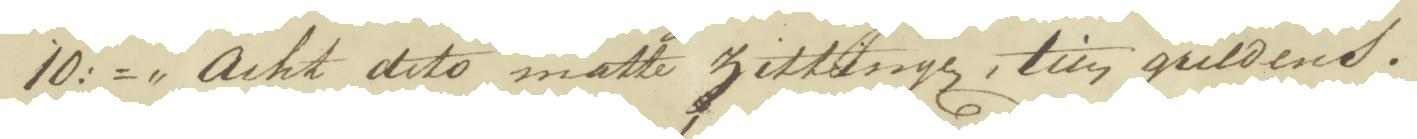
10: =„ Acht dito matte zittingen, tien guldens.
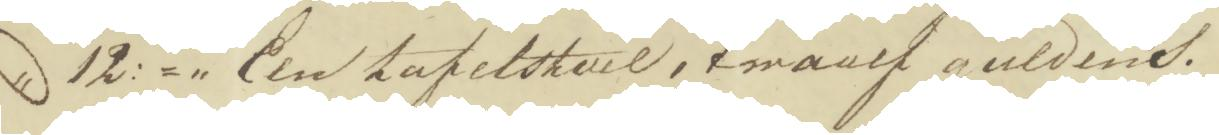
12:=„ Een tafelstoel, twaalf guldens.
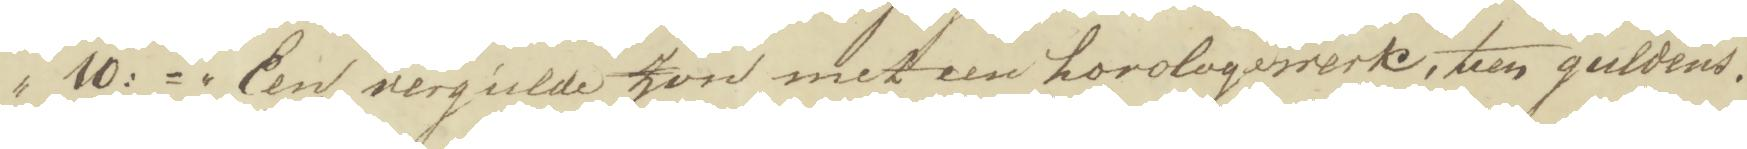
„ 10:=„ Een vergulde zon met een horologewerk, tien guldens.
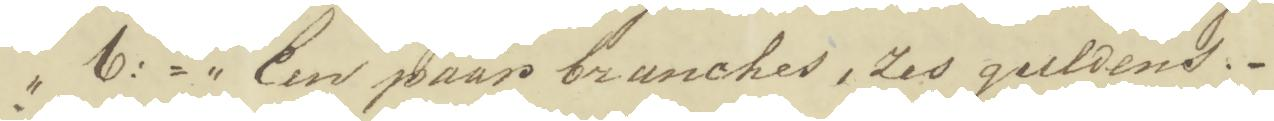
„ 6: =„ Een paar branches, zes guldens.-
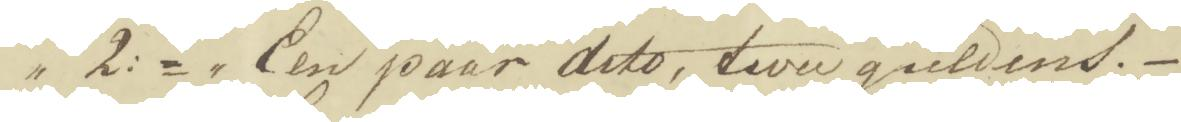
„ 2: = „ Een paar dito, twee guldens.-
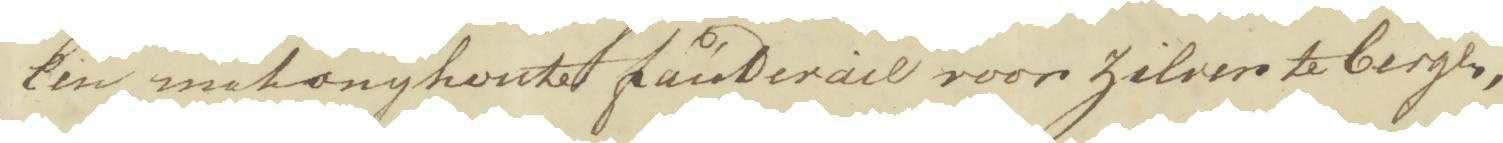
Een mahonyhoute fauderail voor zilver te bergen
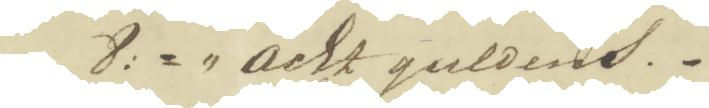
8: = „ acht guldens.
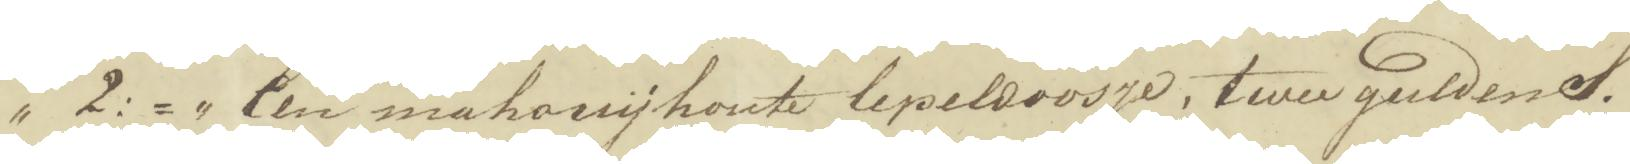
„ 2: = „ Een mahonijhoute lepeldoosje, twee guldens.
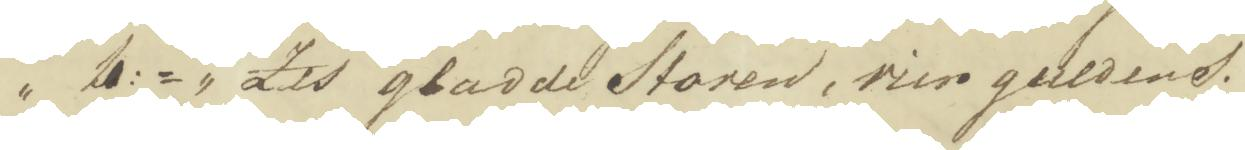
„ 4: = „ zes gladde stoven, vier guldens.
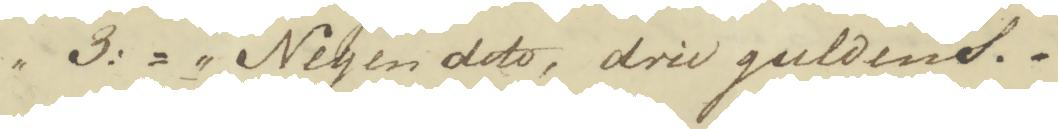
„ 3: = „ Negen dito, drie guldens.-
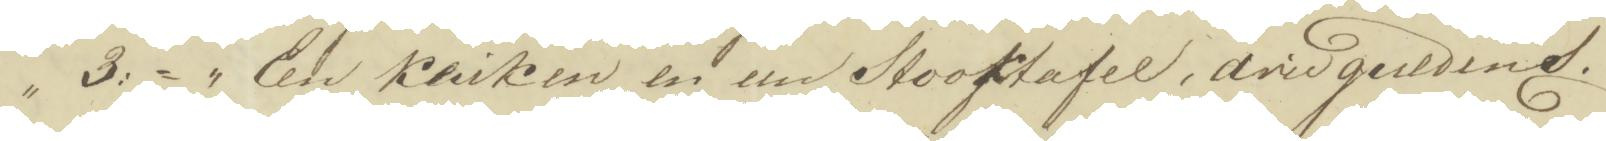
„ 3: = „ Een keuken en een stooftafel, drie guldens.
